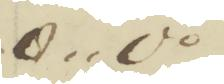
8 „ do
